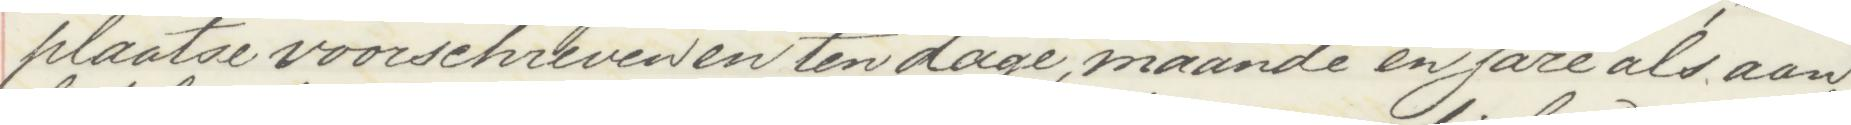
plaatse voorschreven en ten dage, maande en jare als aan
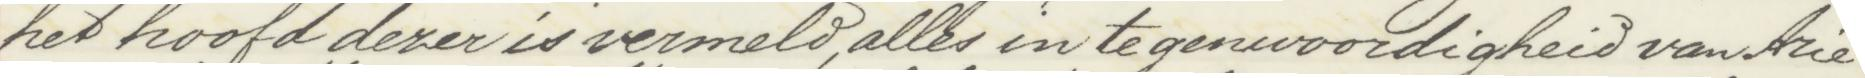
het hoofd dezer is vermeld alles in tegenwoordigheid van Arie
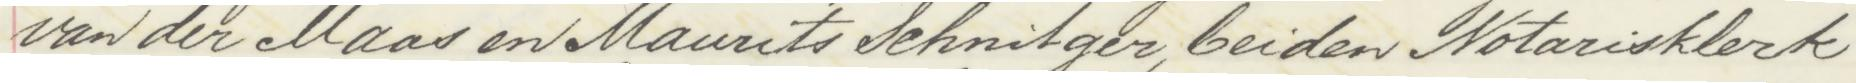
van der Maas en Maurits Schnitger, beiden Notarisklerk
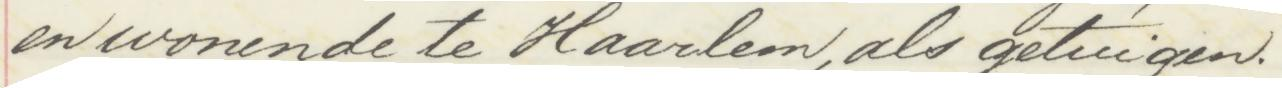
en wonende te Haarlem, als getuigen.
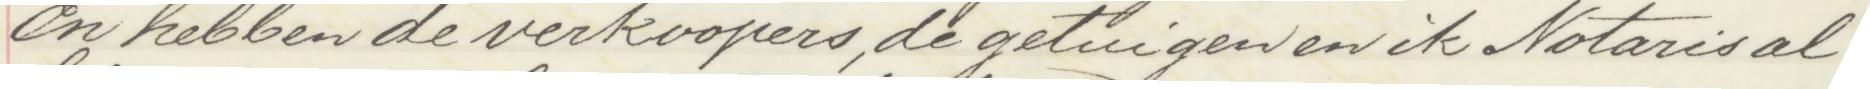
En hebben de verkoopers, de getuigen en ik Notaris al
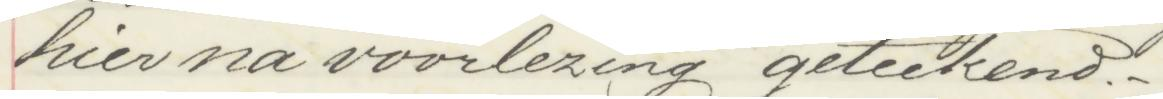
hier na voorlezing geteekend.
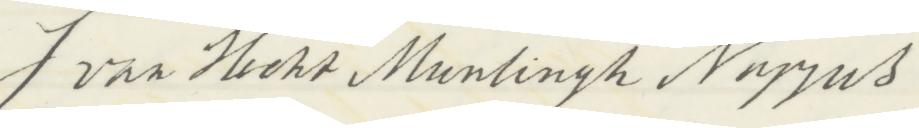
J van Hecht Muntingh Napjus
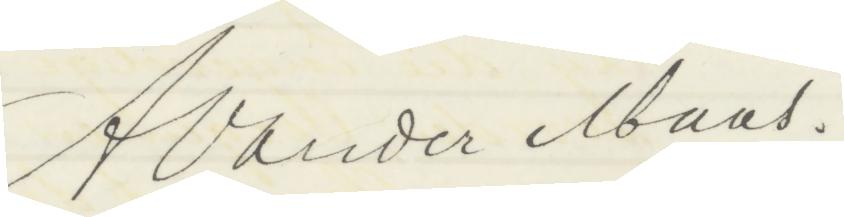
AVander Maas.
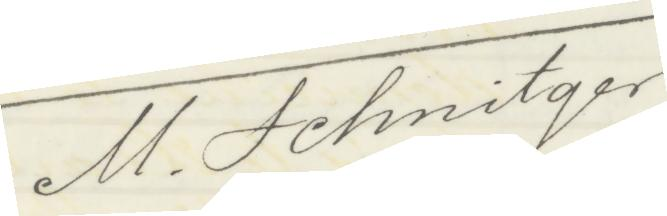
M.Schnitger
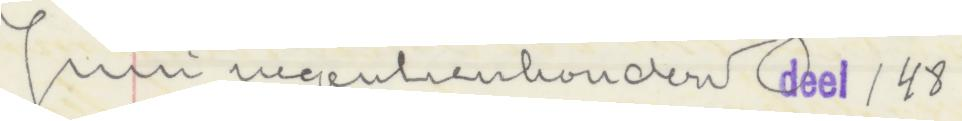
Juni negentienhonderd deel 148
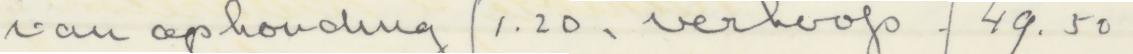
van ophouding ƒ1.20 , verkoop ƒ 49. 50
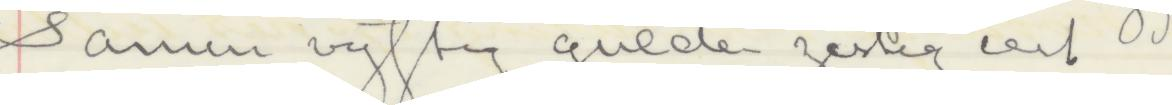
Samen vijftig gulden zestig cent
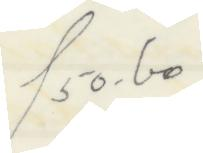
ƒ50-60
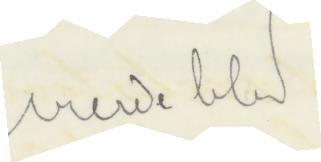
vierde blad
